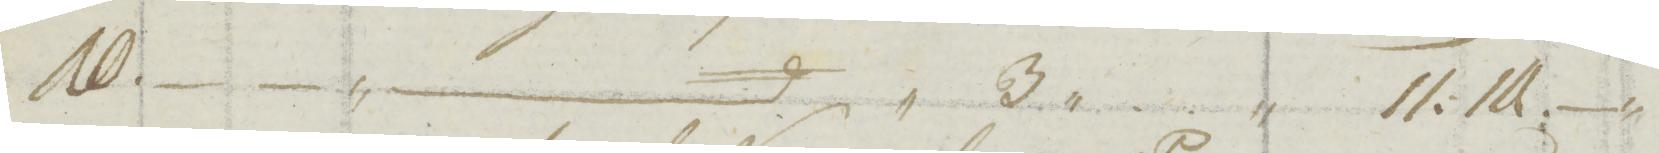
40. — —„ _o „ 3 „ . . „ 11: 14: —„
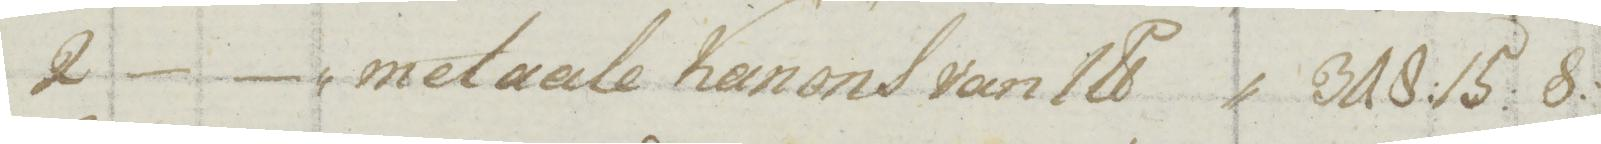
2 — —„ metaale kanons van 1 lb „ 348:15: 8:
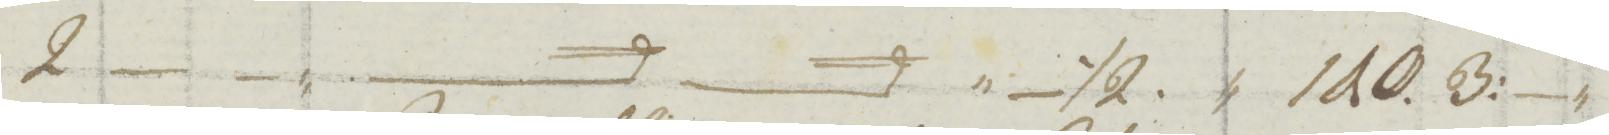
2 — —„ _o _o „ — ½. „ 140. 3: —„
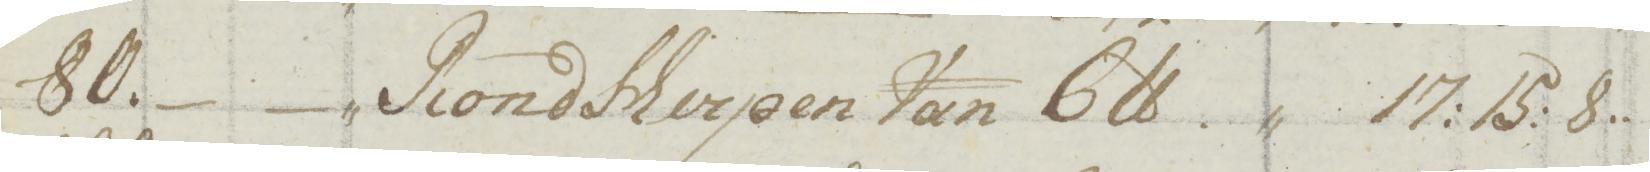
80. — —„ Rondscherpen Van 6 lb. „ 17: 15: 8„
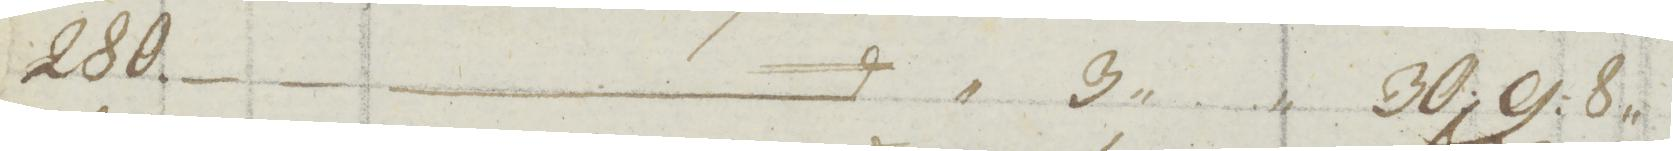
280. — — _o „ 3 „ . . „ 30: 9: 8„
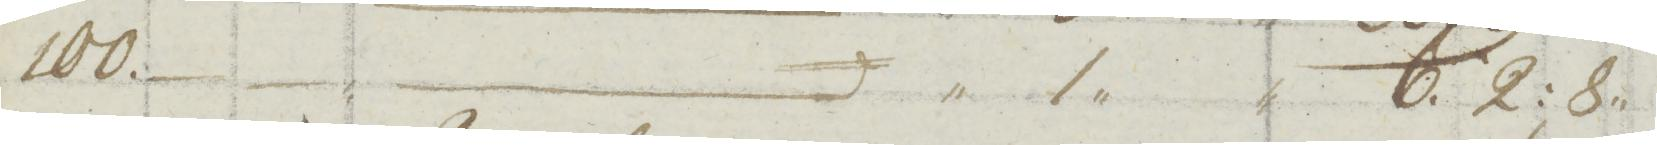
100. — —„ _o „ 1 „ „ 6. 2: 8„
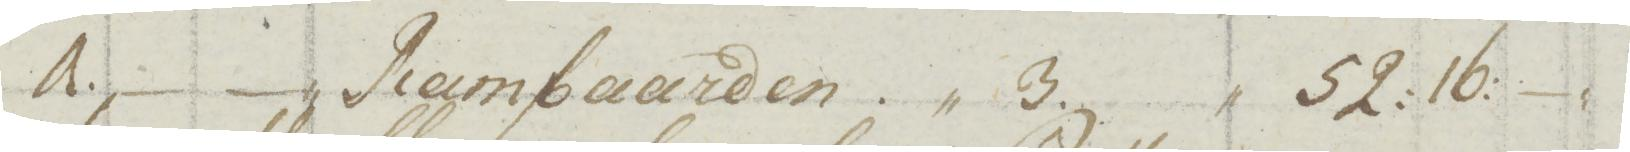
4. — —„ Rampaarden . „ 3. „ 52: 16: —„
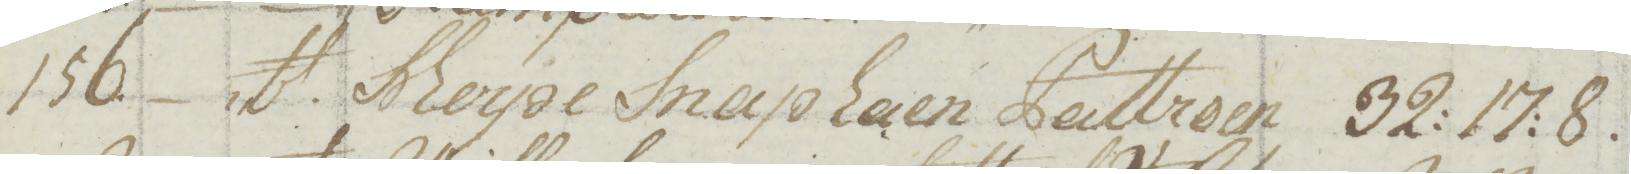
156. —„ b.t scherpe snaphaen Pattroen 32: 17: 8.
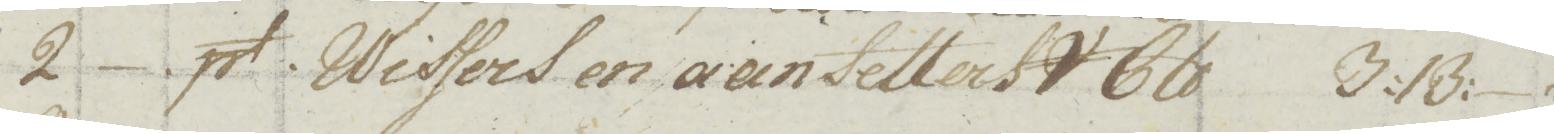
2 —. pt Wissers en aansetters V 6 lb 3:13: —
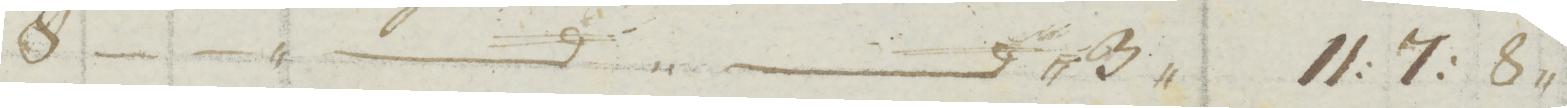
8 — —„ _o „ _o „ 3 „ 11: 7: 8„
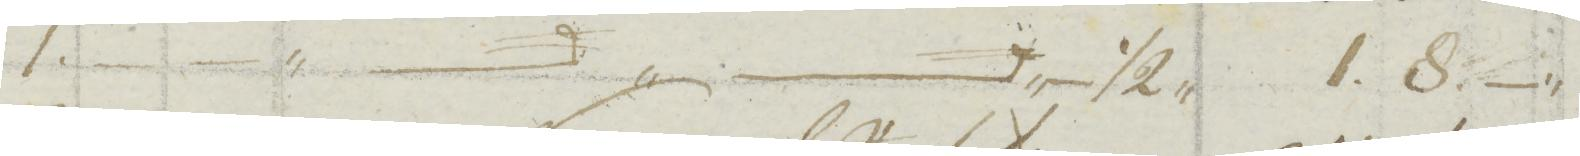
1. — —„ _o „ _o „ — ½ „ 1. 8: —„
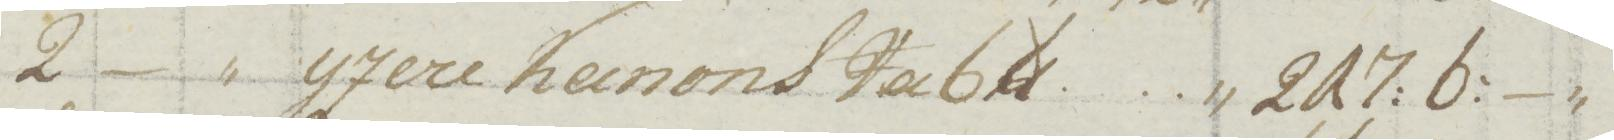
2 — „ ijzere kanons Va 6 lb . . . „ 247: 6: —„
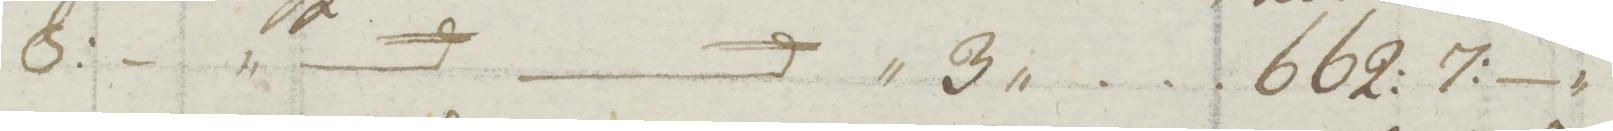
8: — „ _o _o „ 3 „ . . . 662: 7: —„
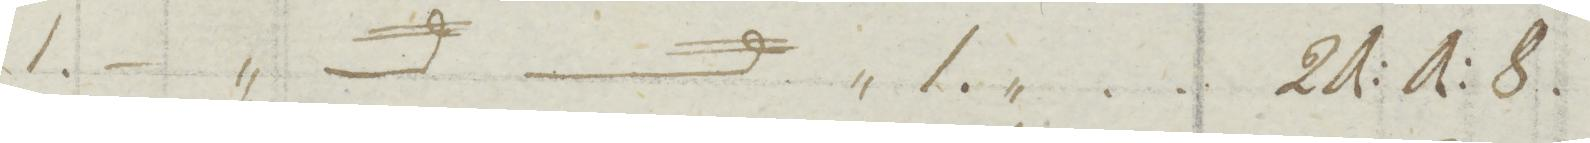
1. — „ _o _o „ 1. „ 24: 4: 8.
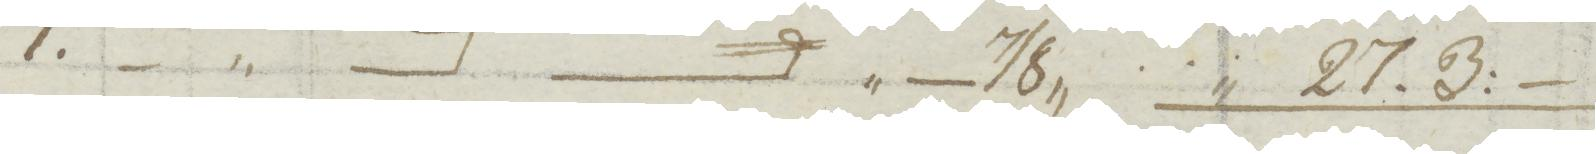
1. — „ _o _o „ — 7/8„ . . „ 27. 3: —
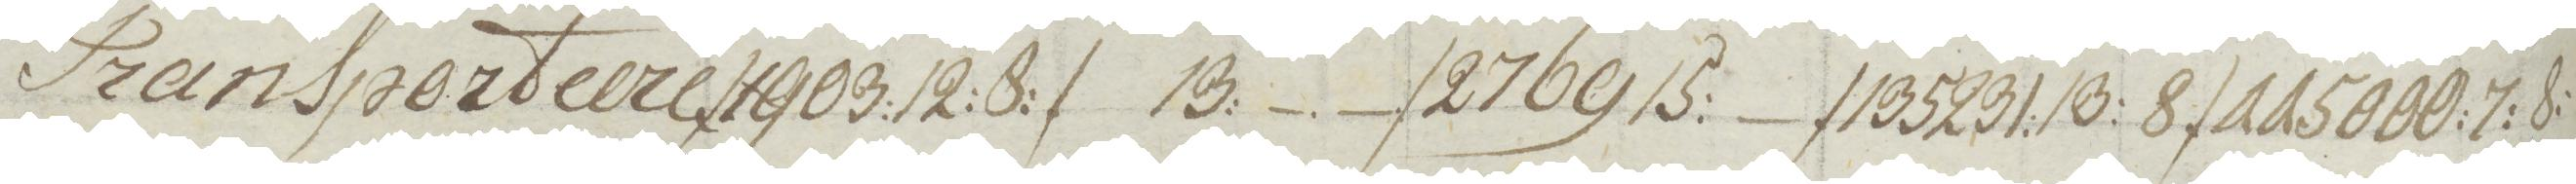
Transporteere ƒ1903:12:8: ƒ 13: —. —. ƒ276915: — ƒ135231:13: 8 ƒ445000:7: 8:
